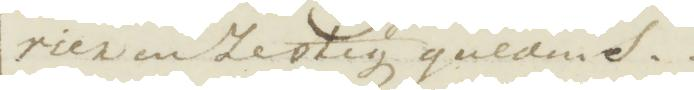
vier en Zestig guldens.
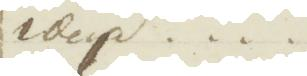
idem . . . .
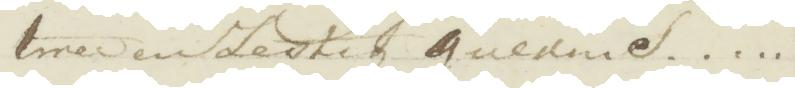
twee en Zestig guldens. . . . .
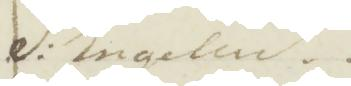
I. Engelen.
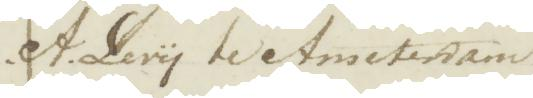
A: Lerij te Amsterdam
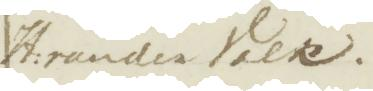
H: vander Valk.
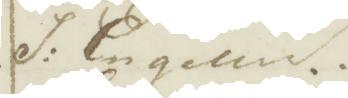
I: Engelen. .
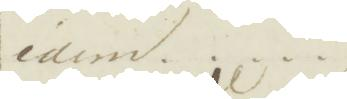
idem . . . . .
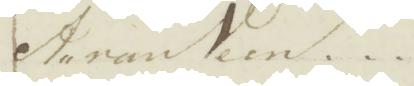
A„ van Veen. .
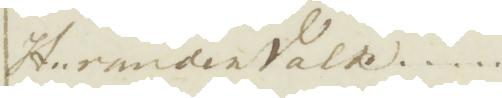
H. van den Valk . . . . .
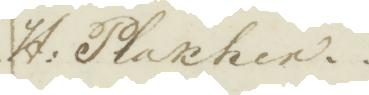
H. Slakker
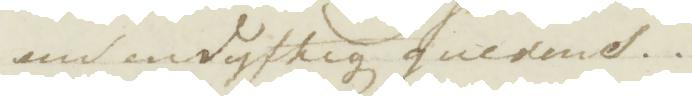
een en Vyftig guldens..
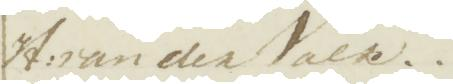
H: van der Valk..
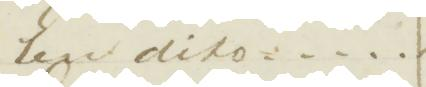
Een dito . . . . .
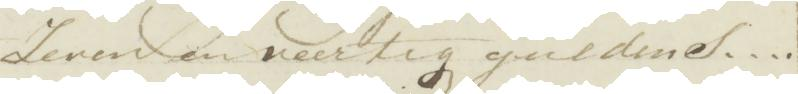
Zeven en veertig guldens . . . .
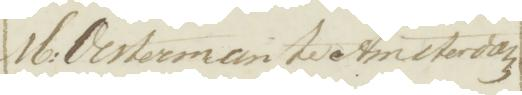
M: Oosterman te Amsterdam
